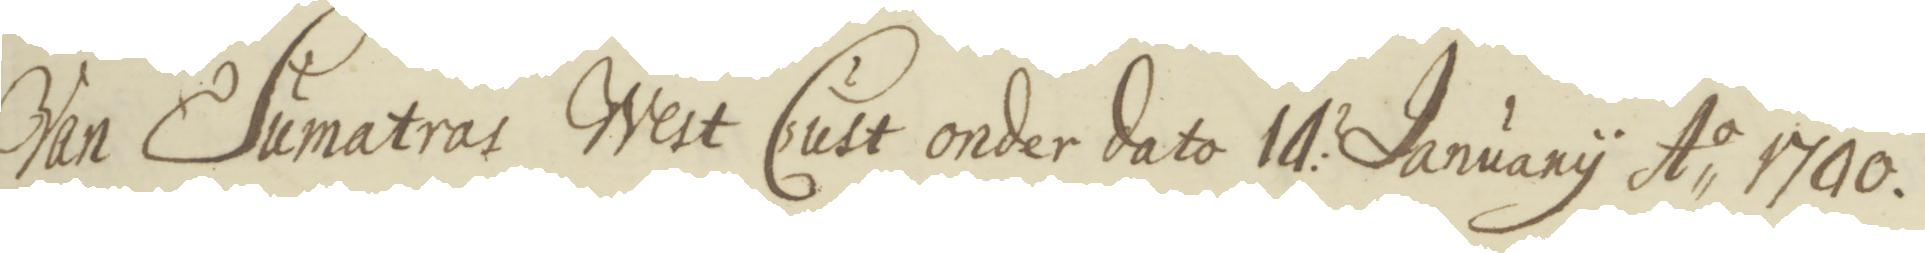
Van Sumatras West Cust onder dato 14:' Januarij A„o 1740.
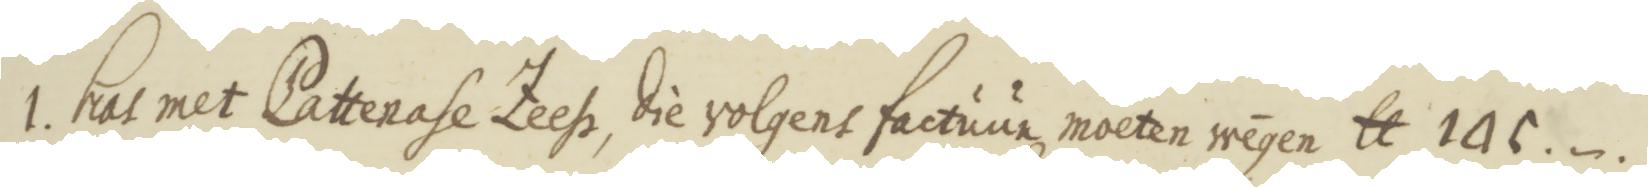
1. kas met Pattenase zeep, die volgens factuur moeten wegen lb 145. – .
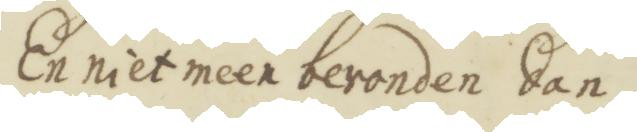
En niet meer bevonden dan „. 129. – .
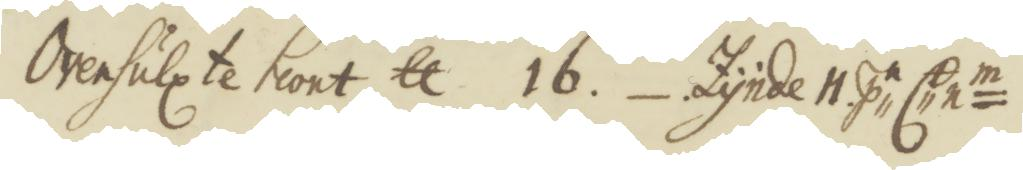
Oversulx te kort lb 16. – . zijnde 11 p„r C„t r=m
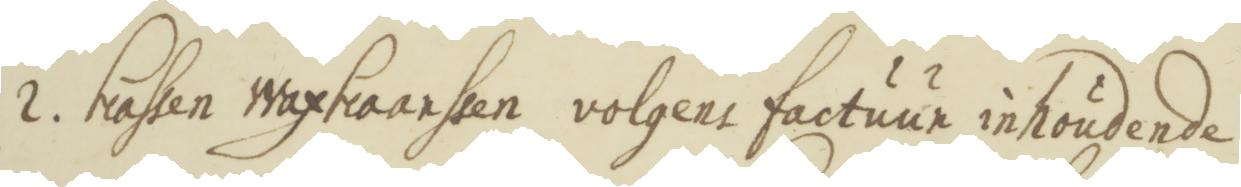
2. kassen waxkaarssen volgens factuur inhoudende
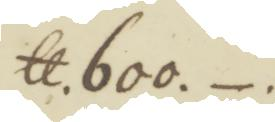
lb. 600. – .
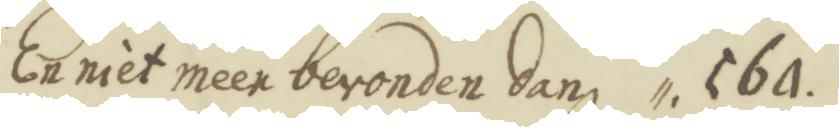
En niet meer bevonden dan „. 564. – .
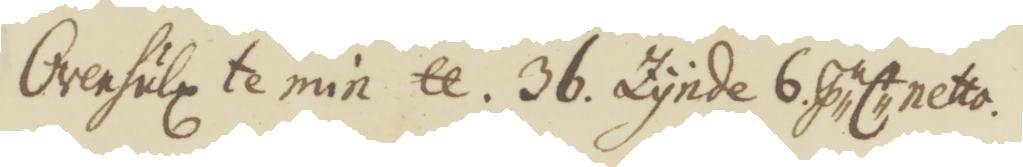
Oversulx te min lb. 36. zijnde 6. p„rC„t netto.
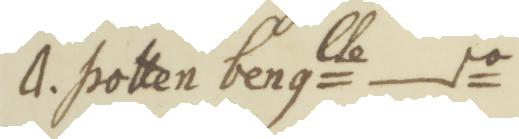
4. potten beng=lse _=o
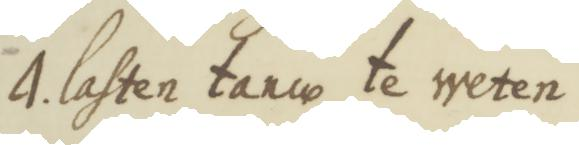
4. lasten tarw te weten
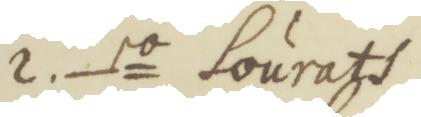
2. _=o sourats
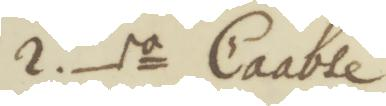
2. _=o Caabse
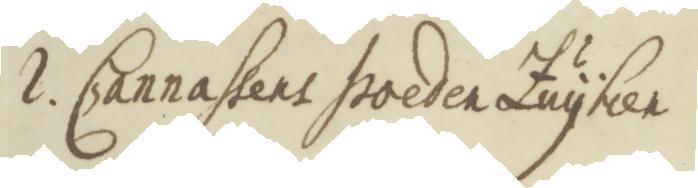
2. Canassers poeder zuijker
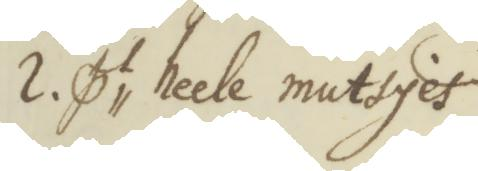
2. p„s heele mutsjes
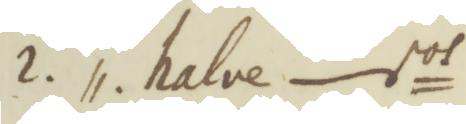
2. „. halve _=os
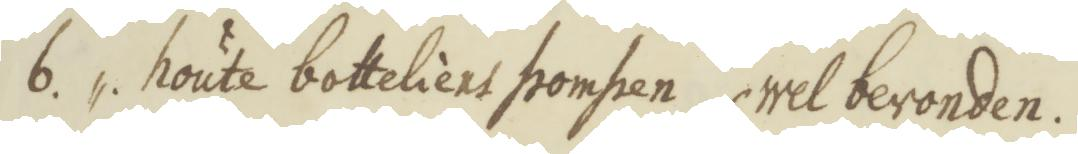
6. „. houte botteliers pompen wel bevonden.
